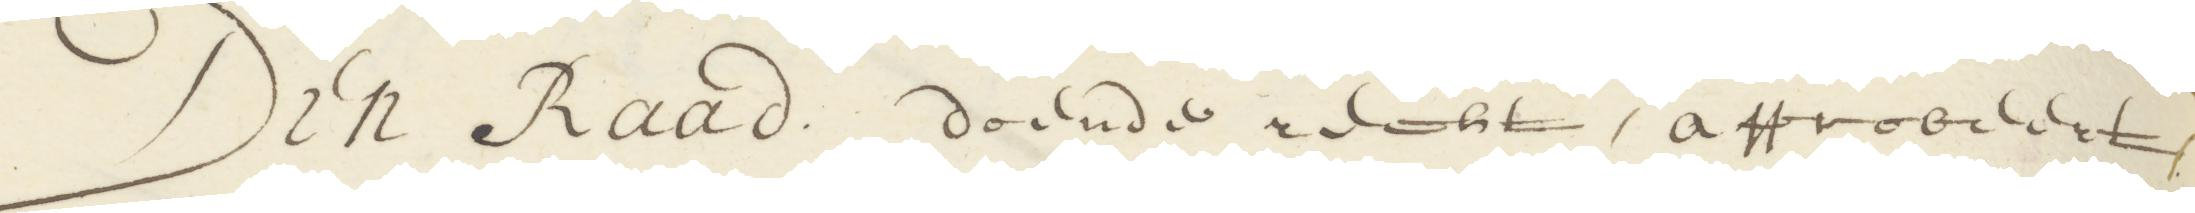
Den Raad. doende recht, approbeert,
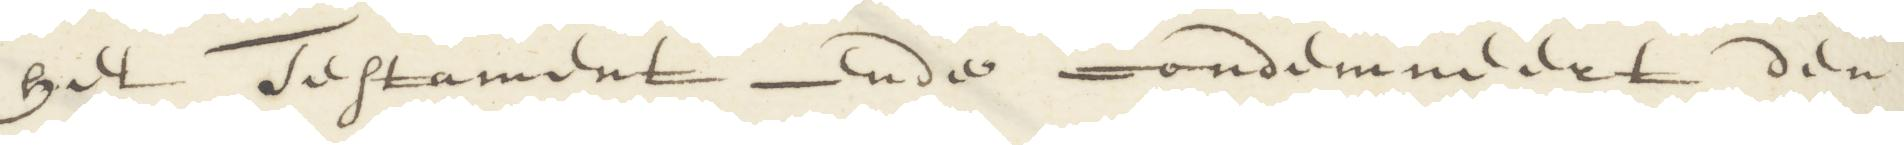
het Testament Ende condemneert den
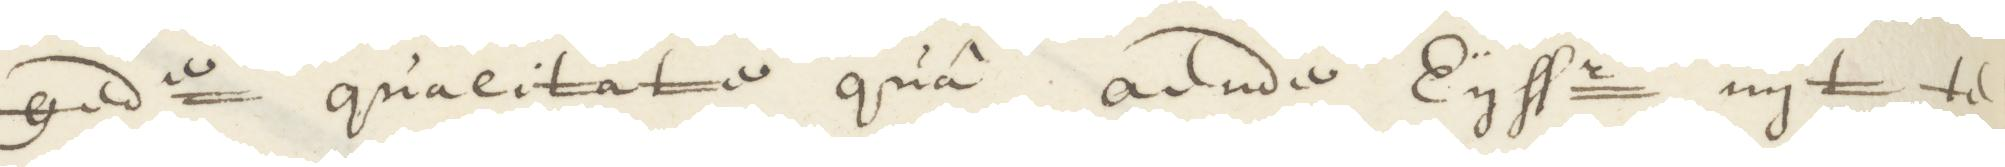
ged=e qualitate quâ aende Eijss=r uijt te
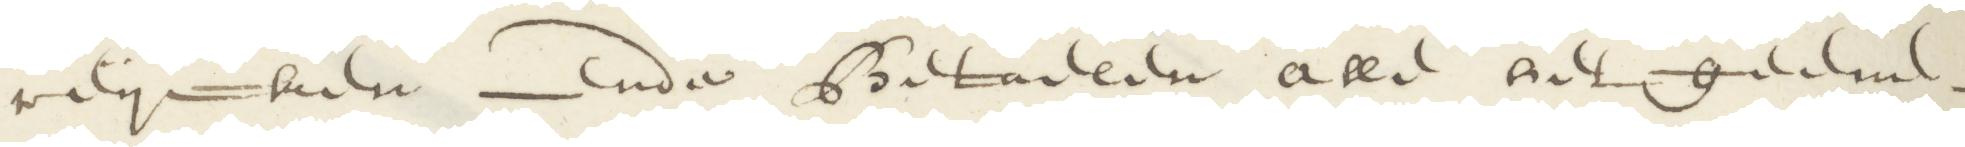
reijcken Ende Betaelen alle het geene
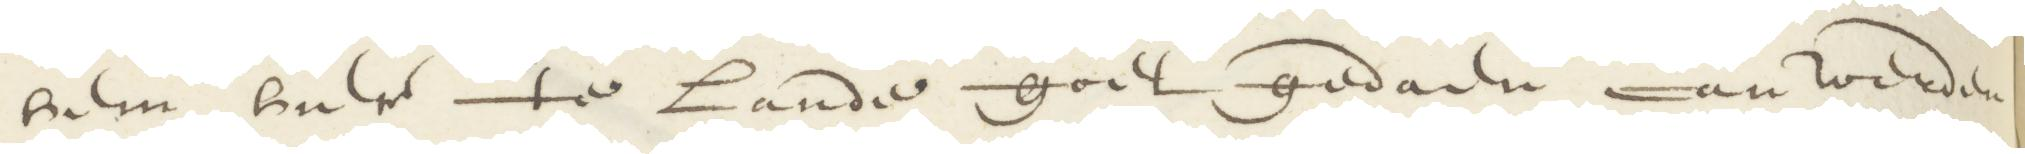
hem hier te lande goet gedaen can werden
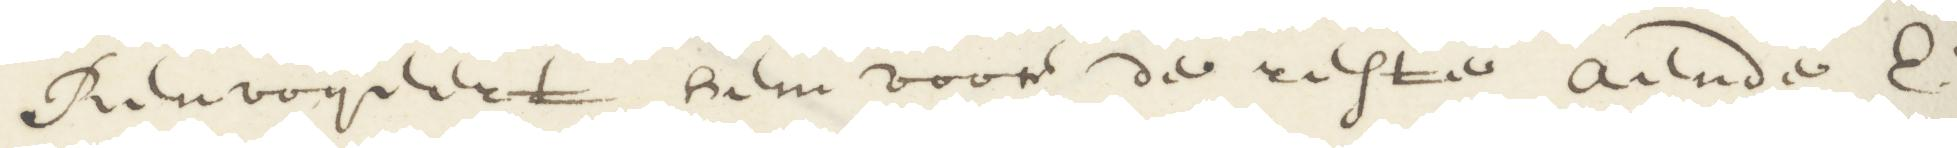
Renvoijeert hem voor de reste aende E:
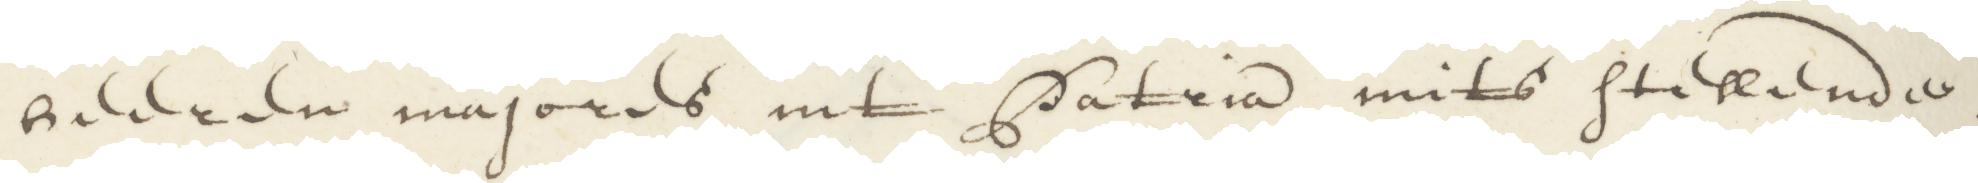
heer en majores int Patria mits stellende
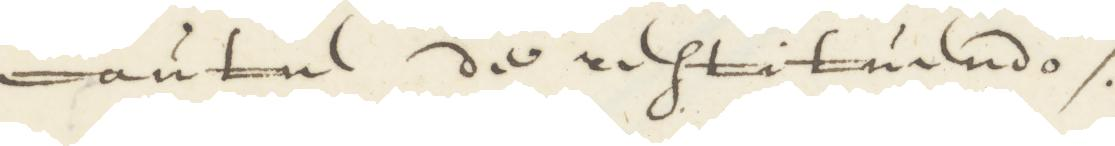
cautie de restituendo /
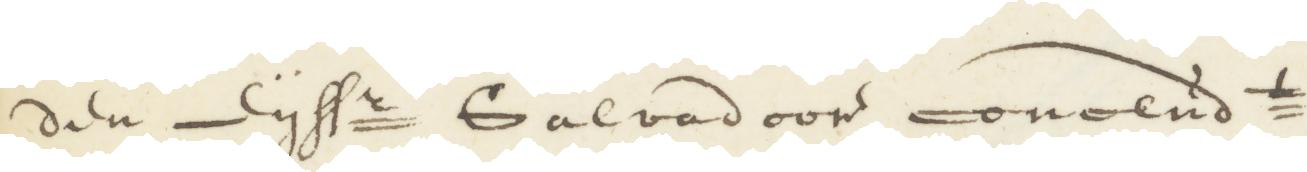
den eijss=r Salvadoor conclud=t
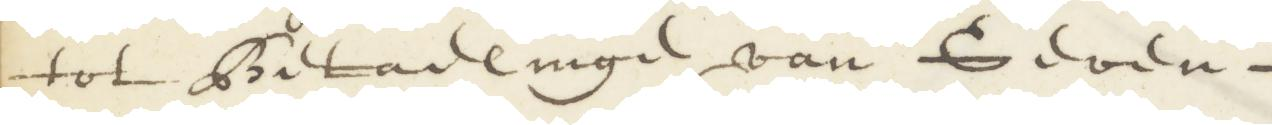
tot Betaelinge van Seven
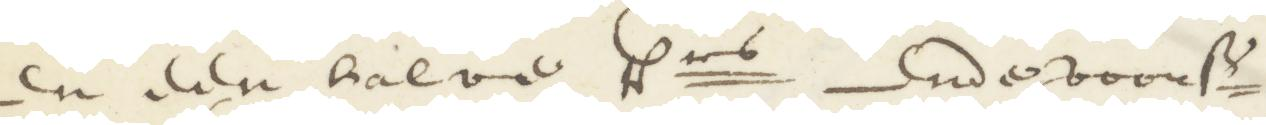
en een halve R=rs Ende voor=s
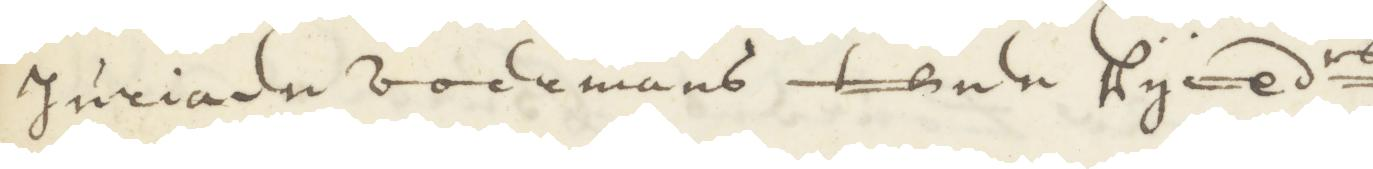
Juriaen voermans thien Rijcxd=rs
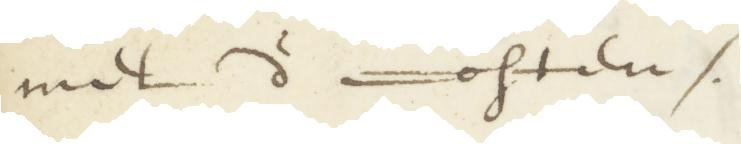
met d' costen.
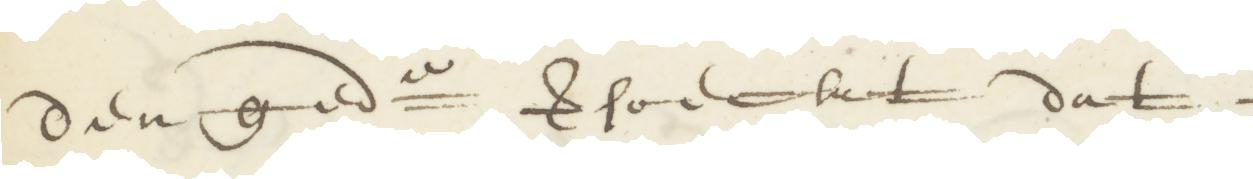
den ged=e versoeckt dat
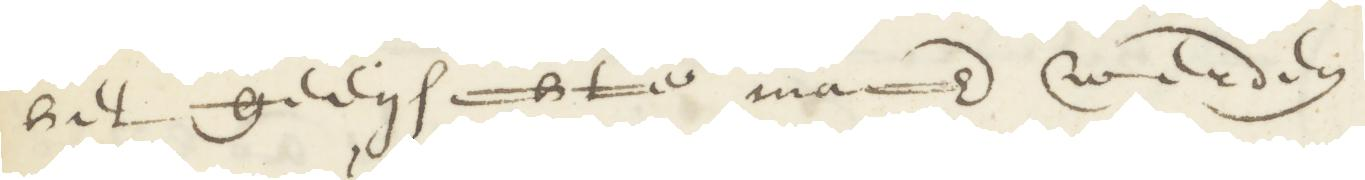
het geeijschte mach werden
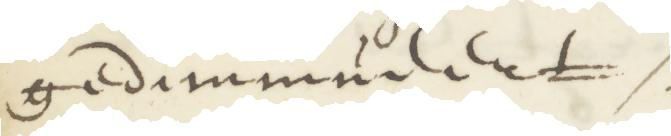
gedimmueert
